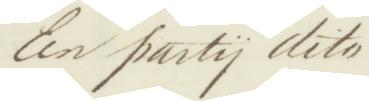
Een partij dito
